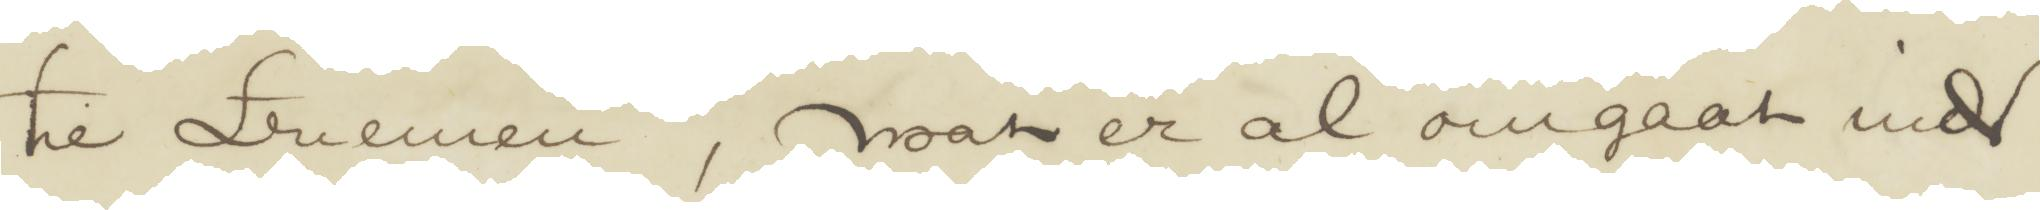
tie tenemen, wat er al omgaat inde
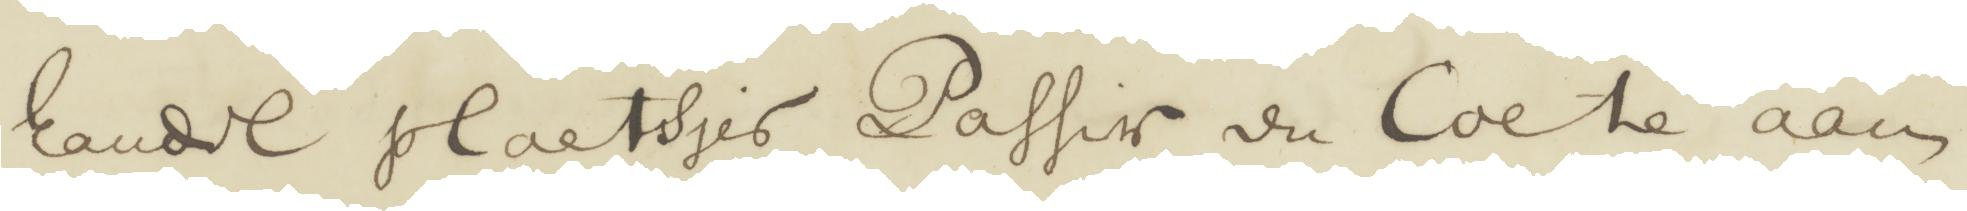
handel plaetsjes Passir en Coeté aan
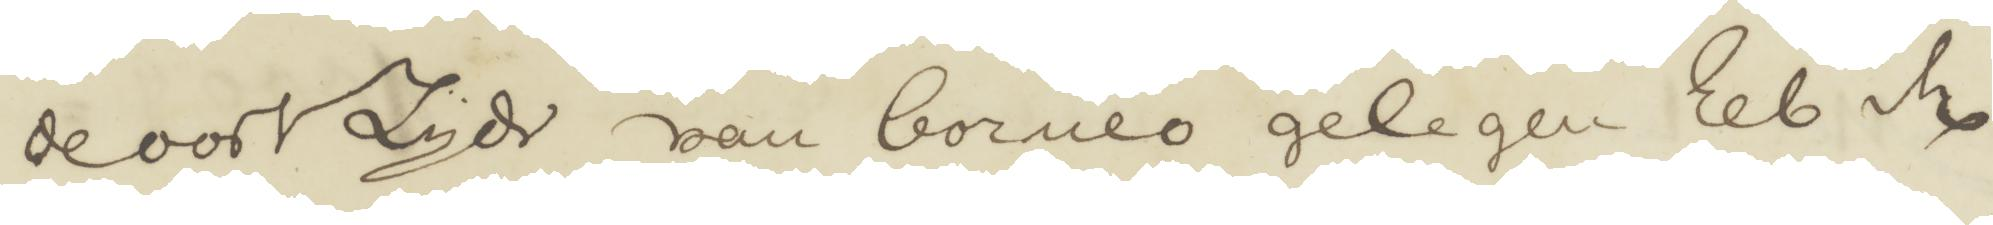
de oost zijde van borneo gelegen heb ik
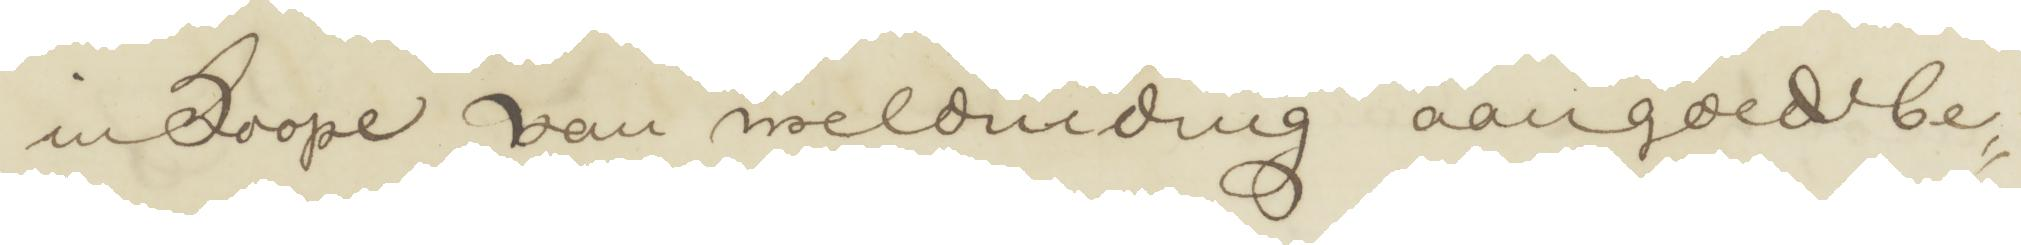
in hoope van welduiding aan goede be„
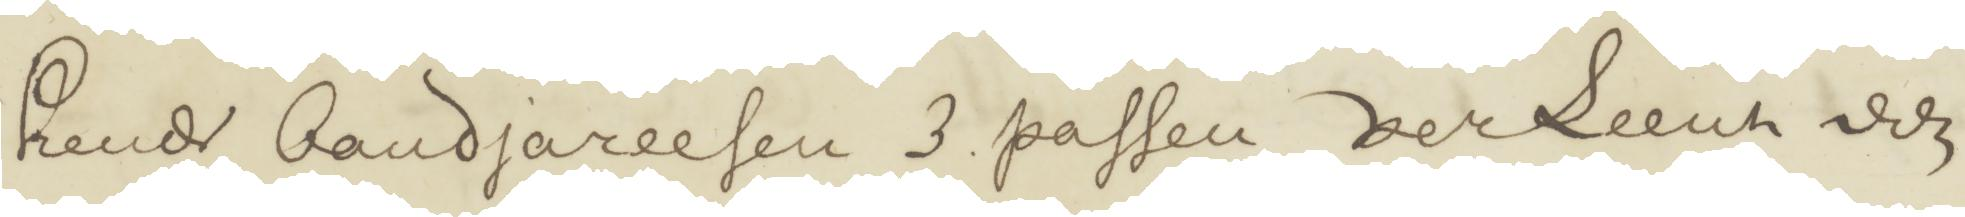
kende bandjareesen 3. passen verleent een
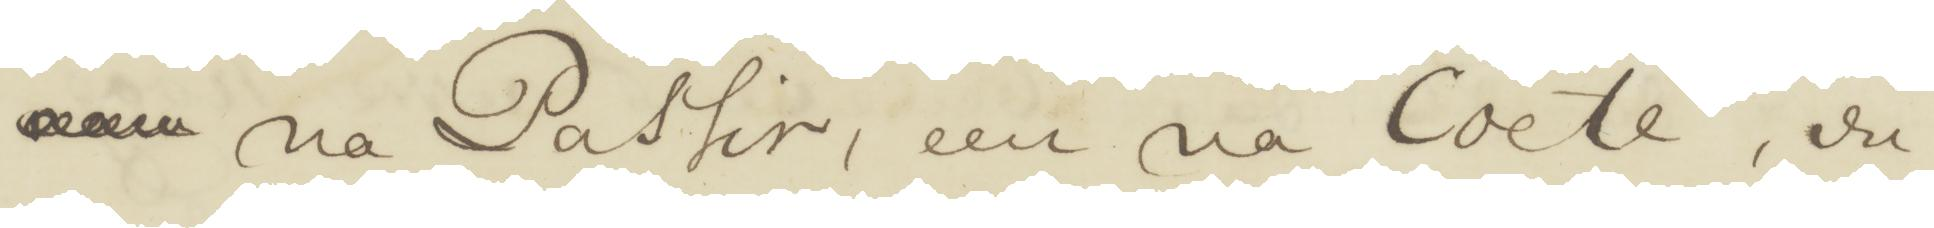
een na Passir, een na Coeté, en
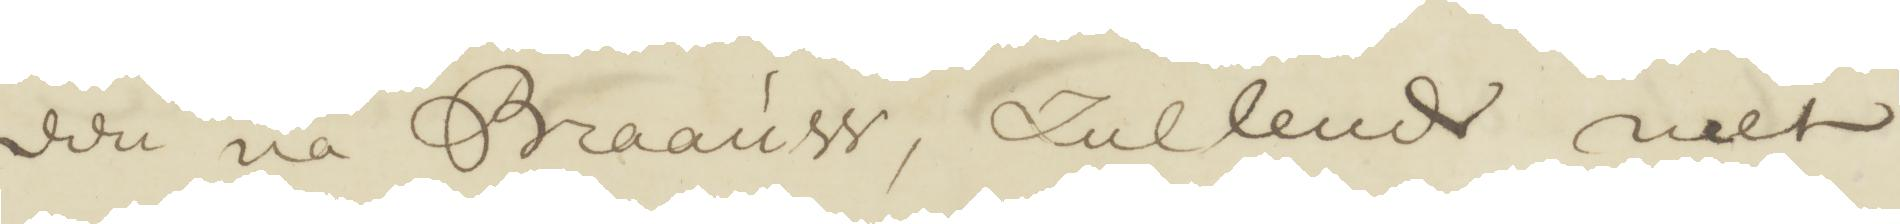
een na Braauw, zullende niet
